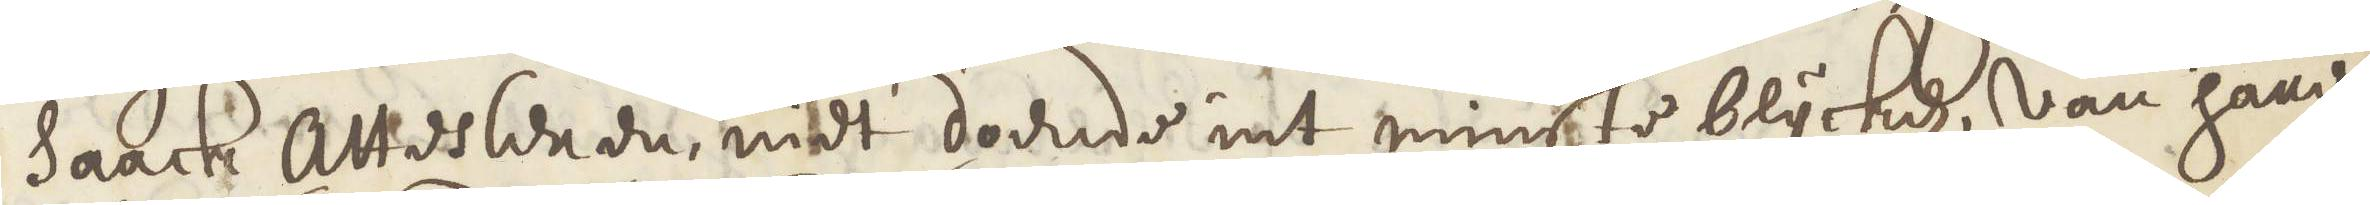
saack Attesteren, niet doende int minste blijcken, van hare
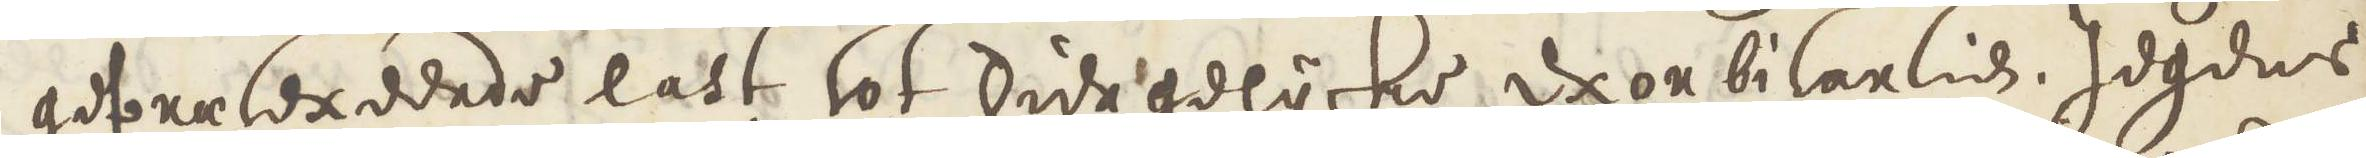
gepraetexeerde last tot diergelijcke exorbitartien. Jegens
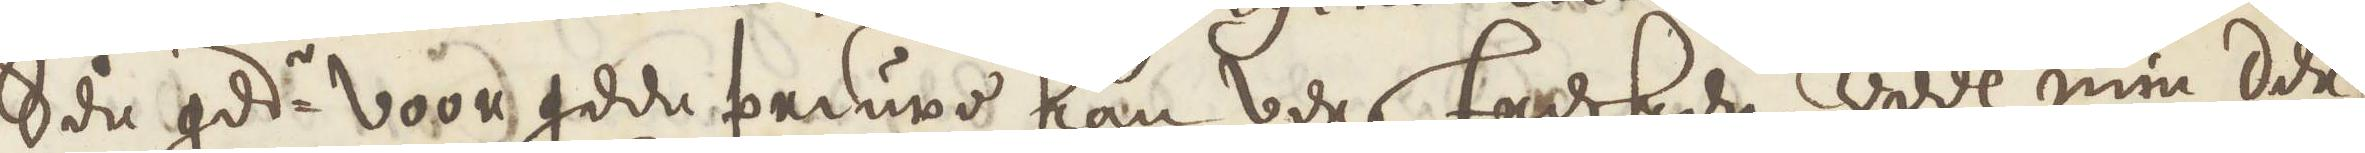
den ged=e voor geen preuve kan verstrecken, veel min der
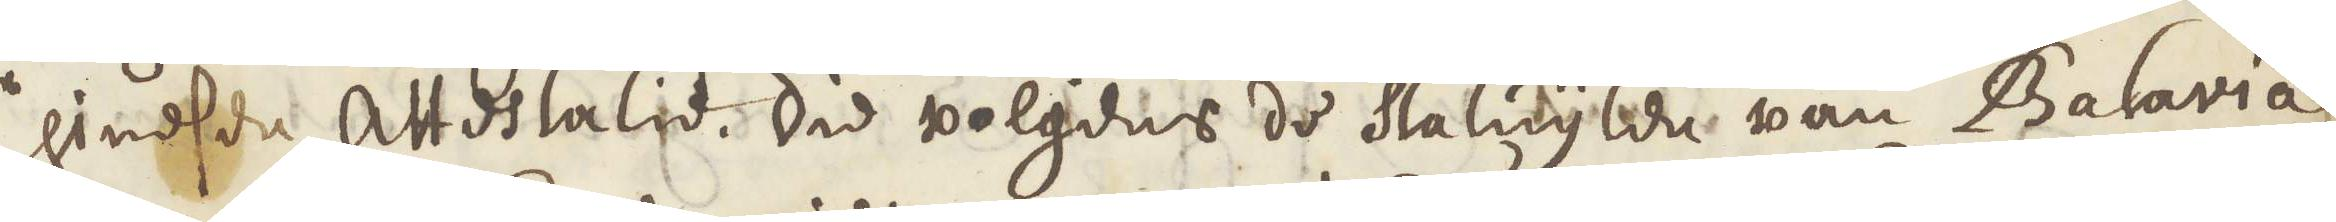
hinesen attestatie, die volgens de statuijten van Batavia
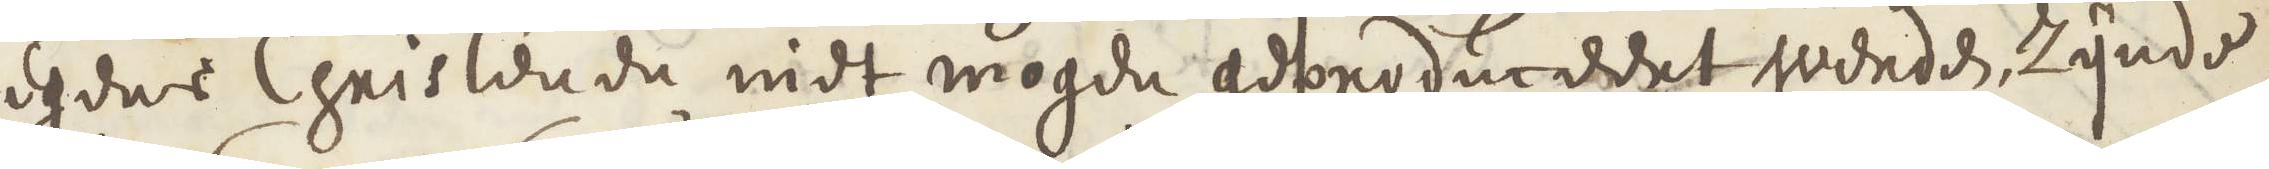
egens Christenen niet mogen geproduceert werden, zijnde
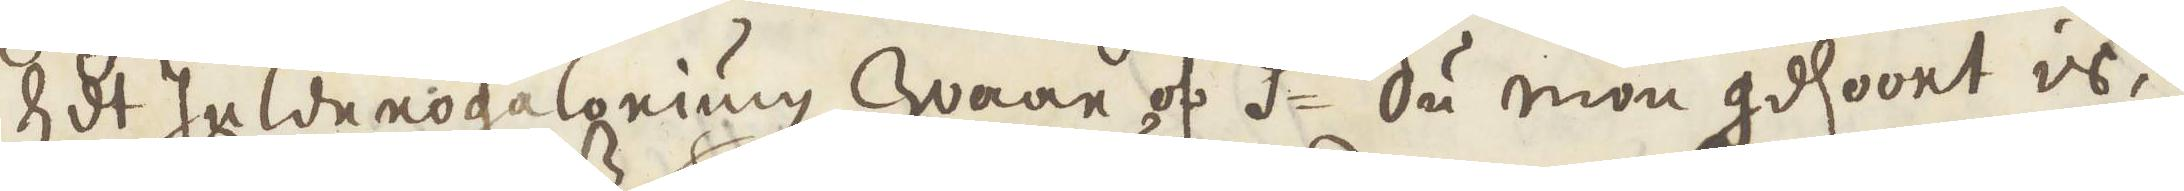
het Jnterrogatorium waar op s=r du mon gehoort is,
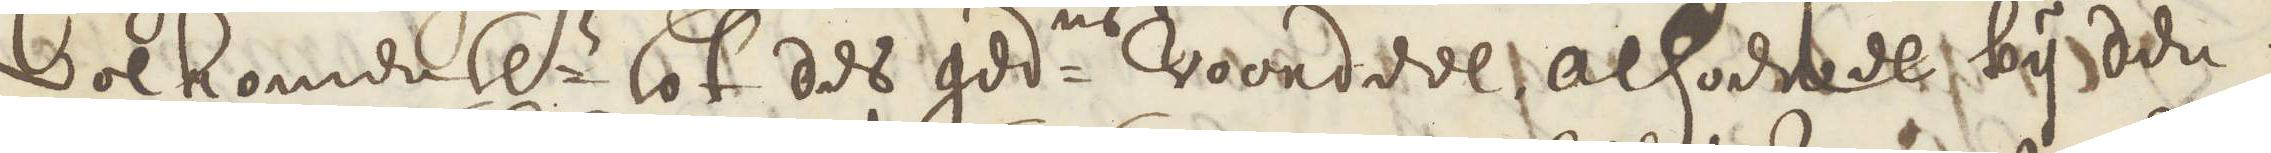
volkomentlijk tot des ged=ns voordeel alhoewel bij den
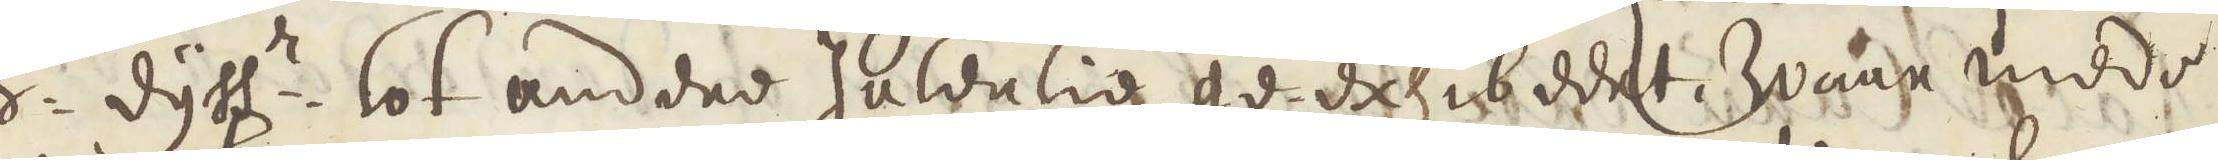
=r Eijss=r tot andere Jntentien ge-exhibeert waer mede
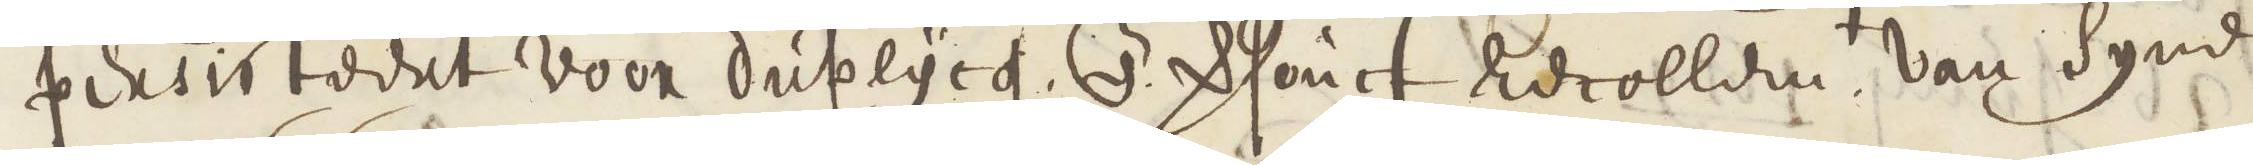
persisteert voor duplijcq. ende versouct recollem.t van sijne
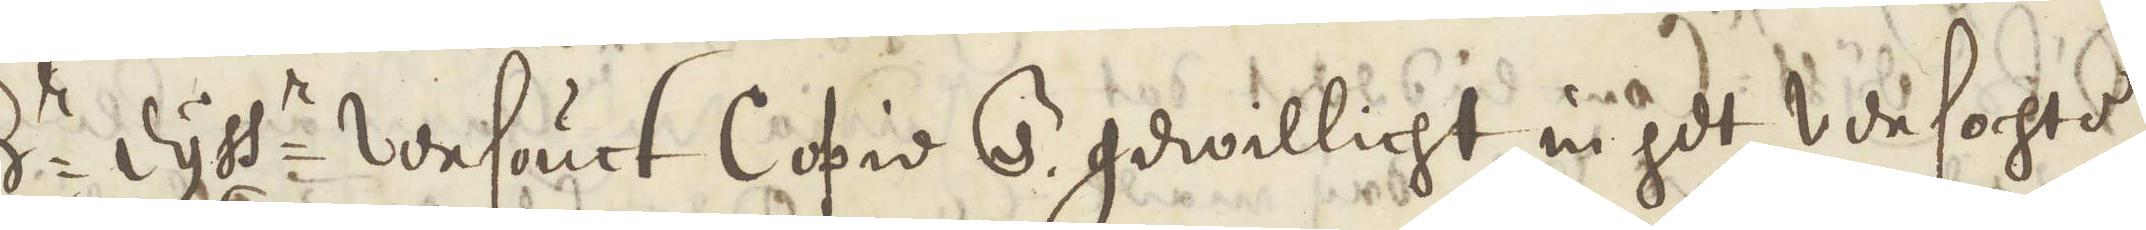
=r Eijss=r versouct Copie ende gewillicht in het versochte
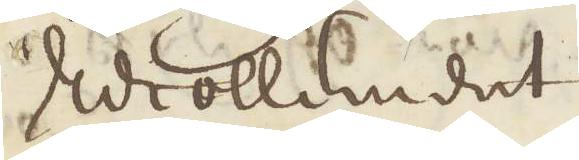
Recollement
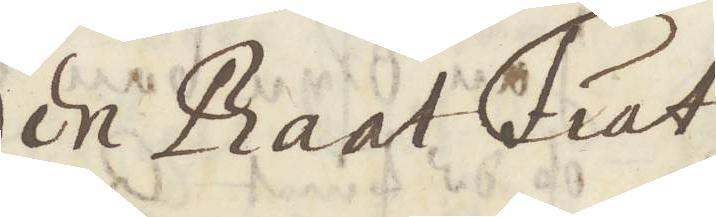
en Raat Fiat
